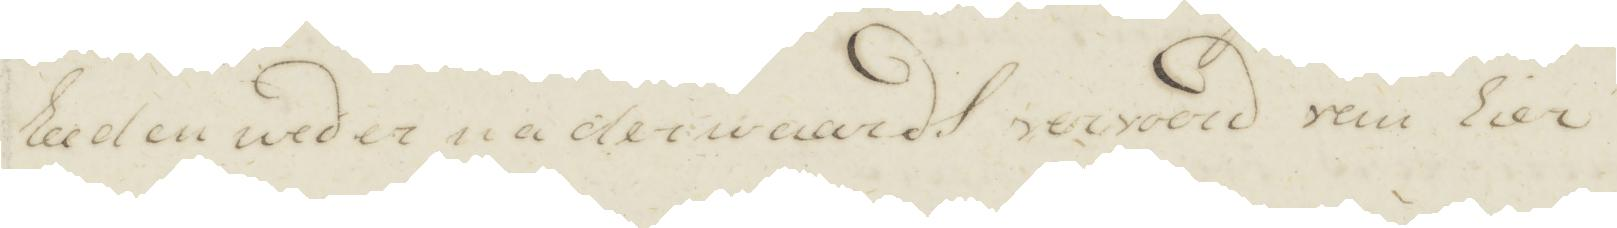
heeden weder na derwaards vervoerd van hier
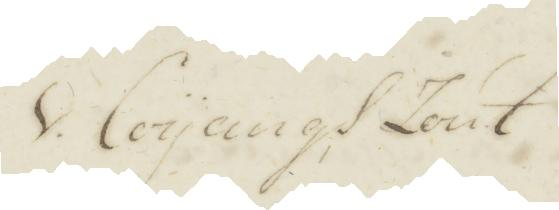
1: Coijangs Zout
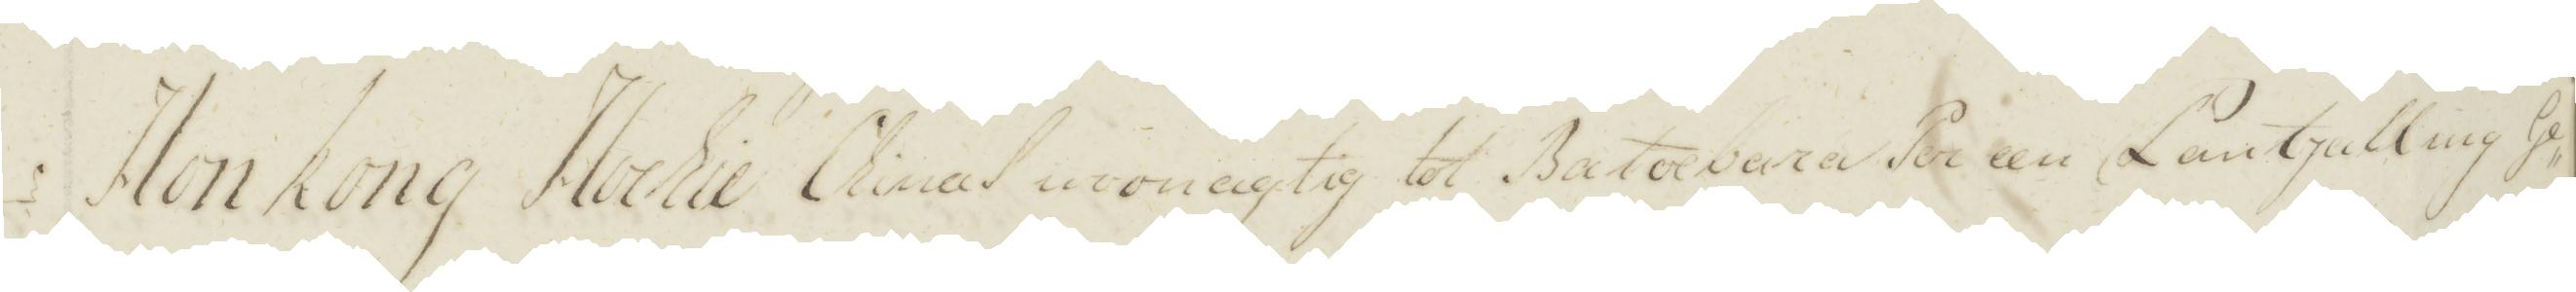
Honkong Hoehie Chinas woonagtig tot Batoebara Per een Pantjalling Ge„
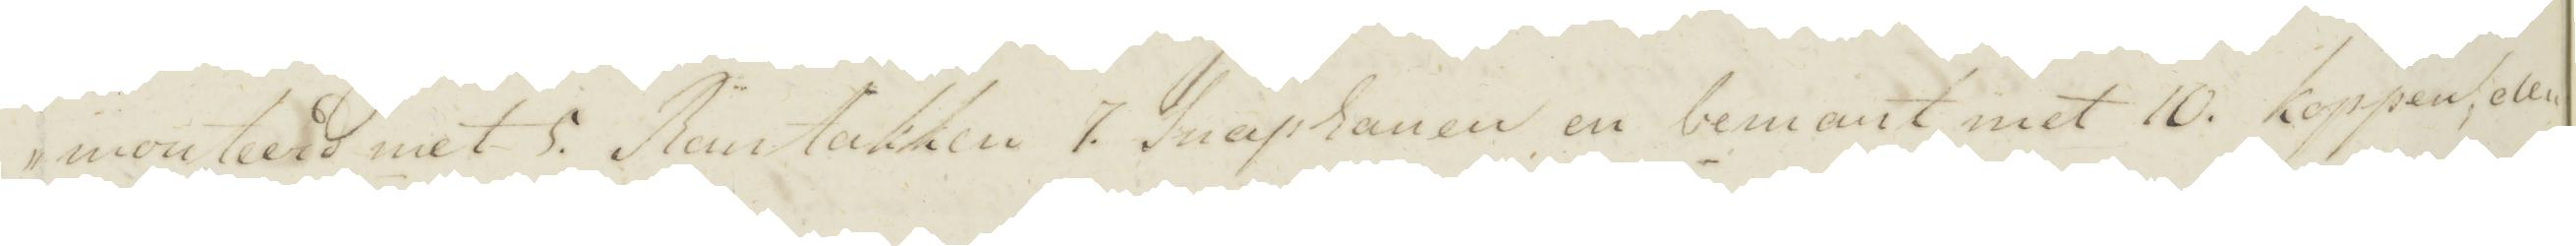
„monteerd met 5. Rantakken 7. Snaphanen en bemant met 10. koppen, den
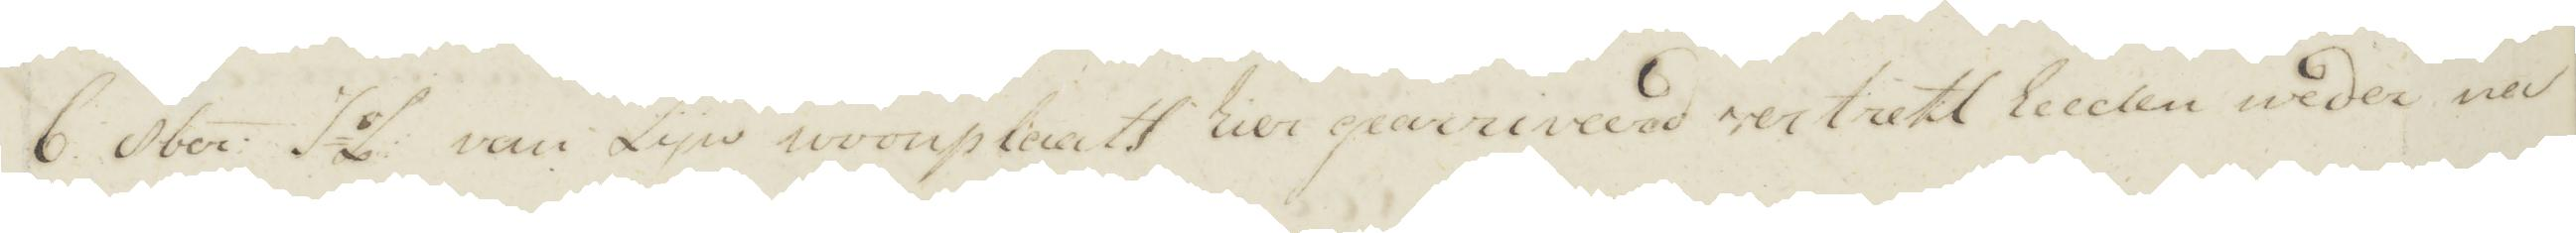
6: 8ber: I:o L: van Zijn woonplaats hier gearriveerd vertrekt heeden weder na
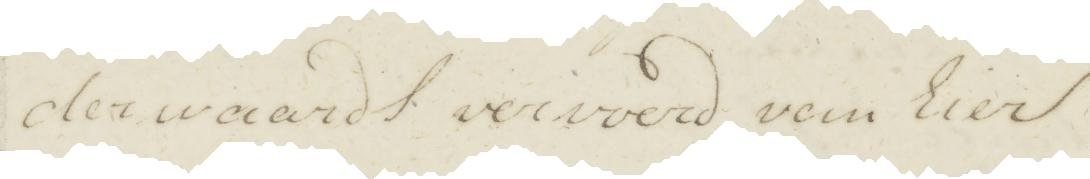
derwaards vervoerd van hier.
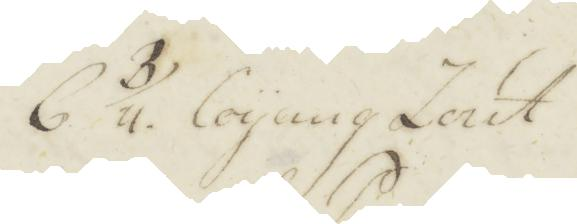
6 ¾. Coijang Zout
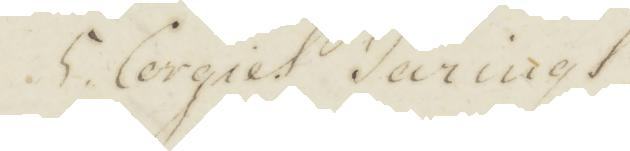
5. Corgies Parings
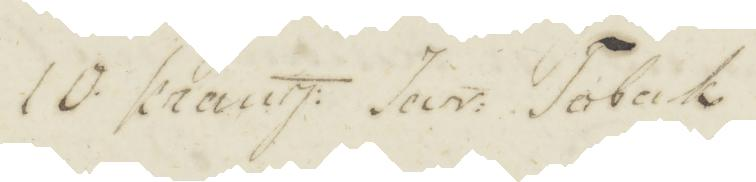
10. kranj: Iav: Tobak
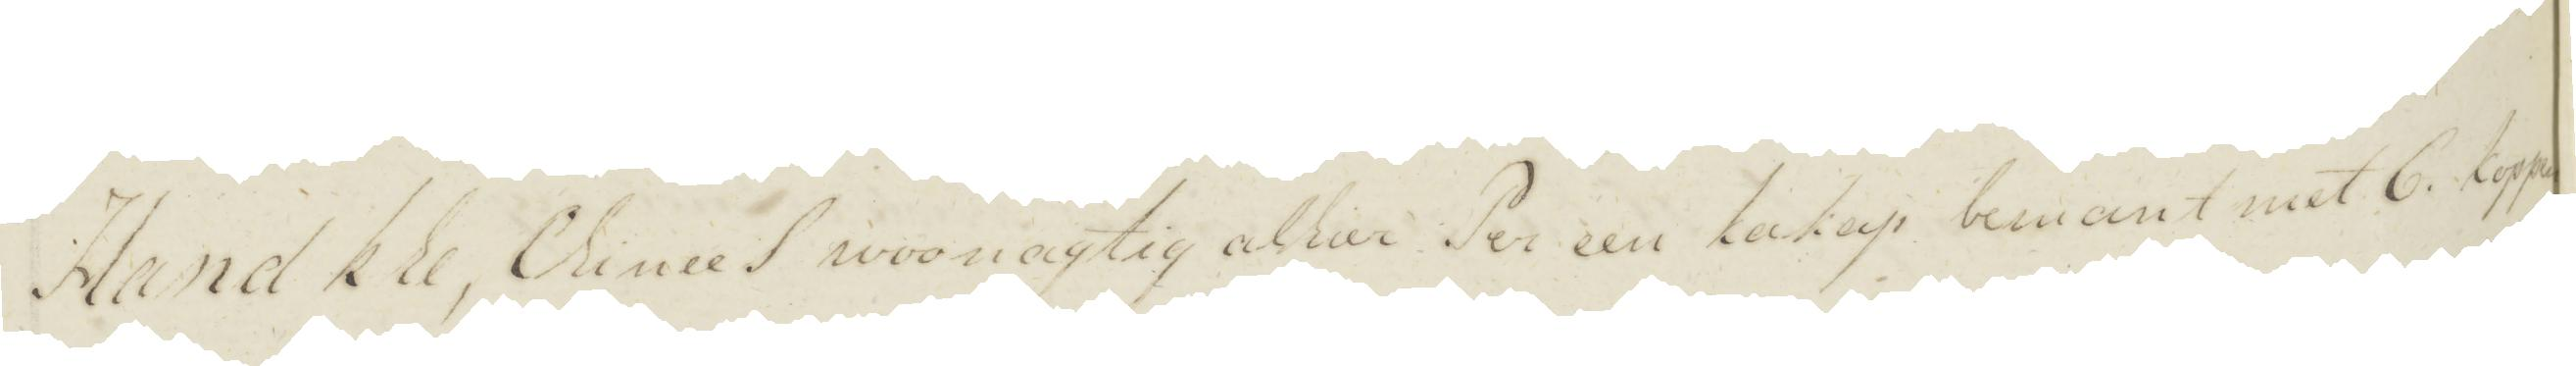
Hand khe, Chinees woonagtig alhier Per een kakap bemant met 6. koppen
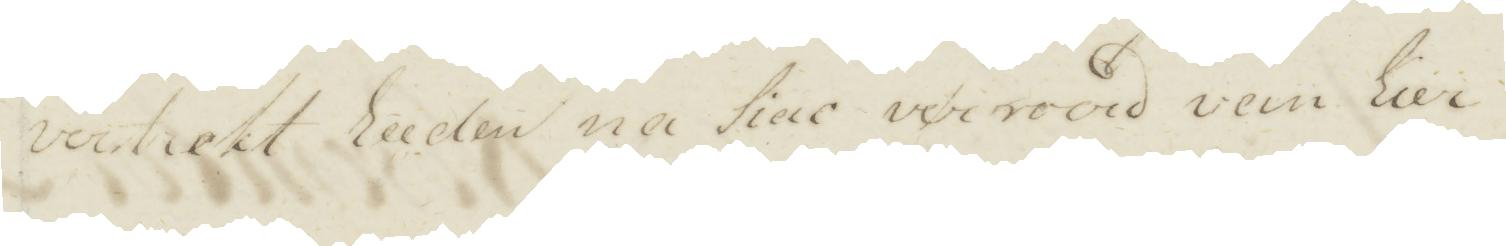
vertrekt heeden na Siac vervoerd van hier
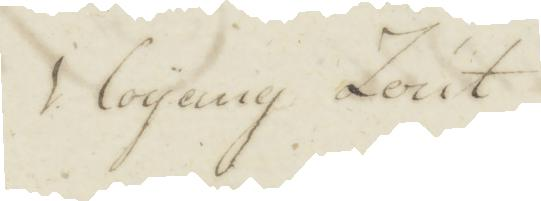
1: Coijang Zout
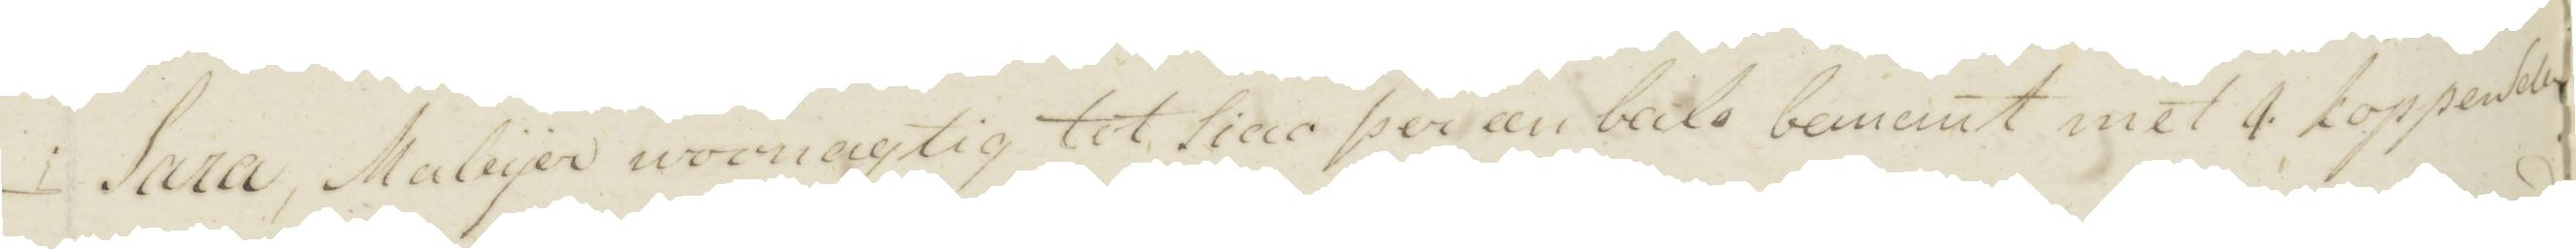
Sara, Maleijer woonagtig tot Siac per een balo bemant met 4 koppen den
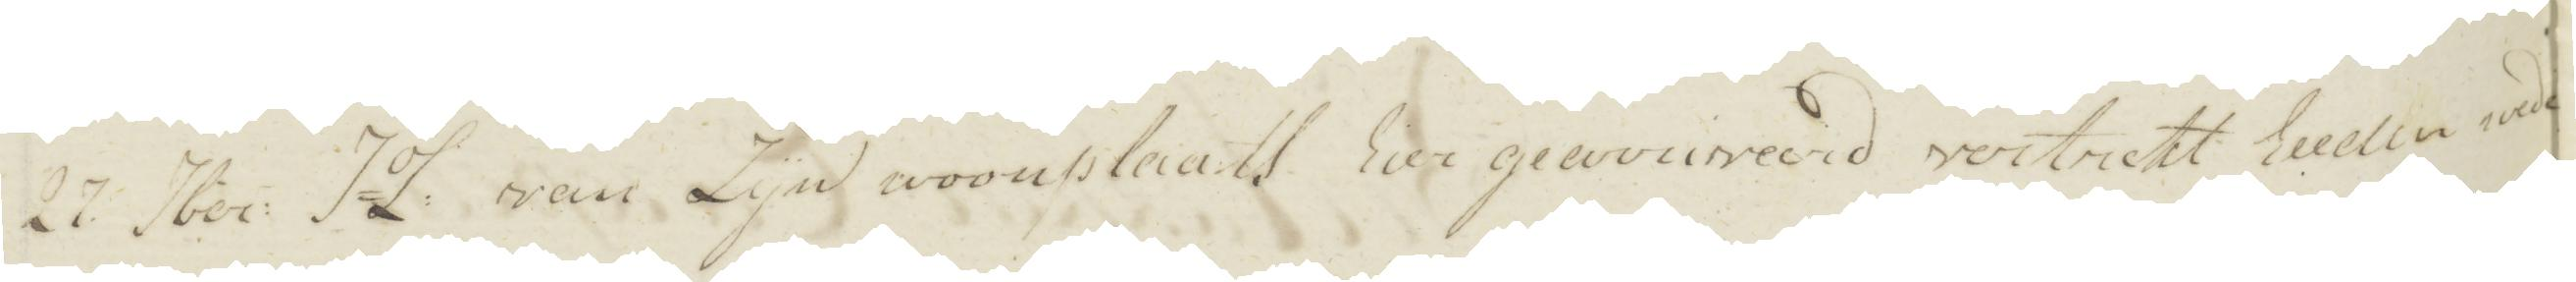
25 7ber: I=o L: van zijn woonplaats hier gearriveerd vertrekt heeden wede
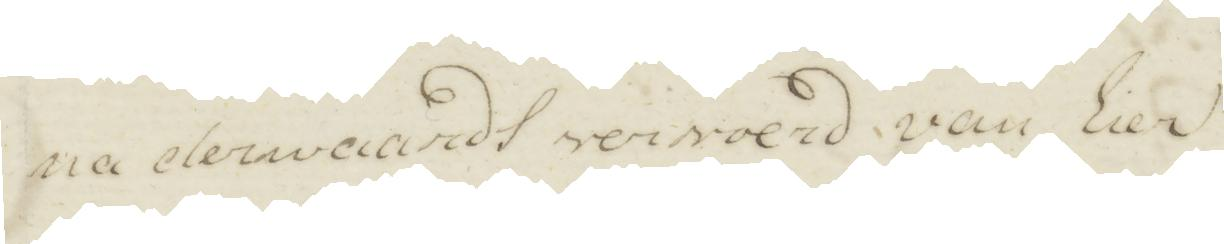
na derwaards vervoerd van hier
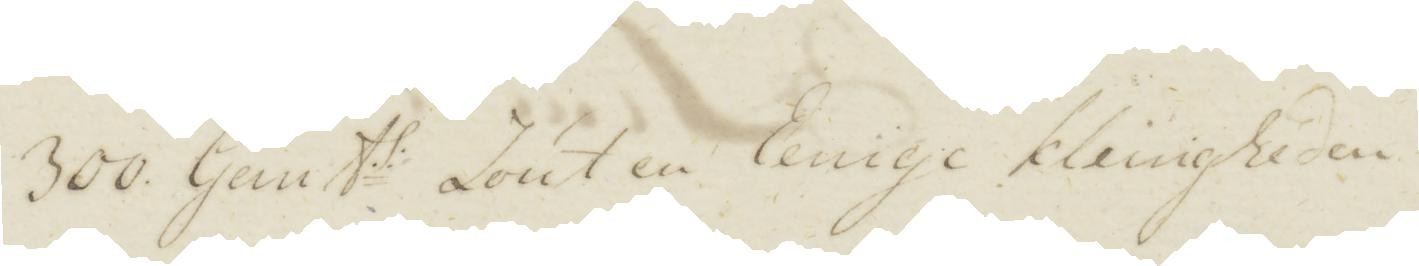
300. Gant=s zout en Eenige kleinigheden
